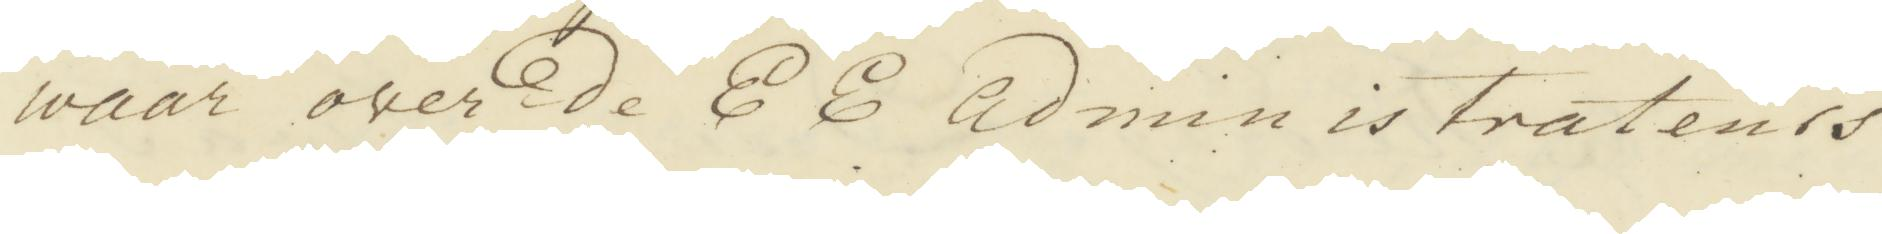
waar over de E E administrateurs
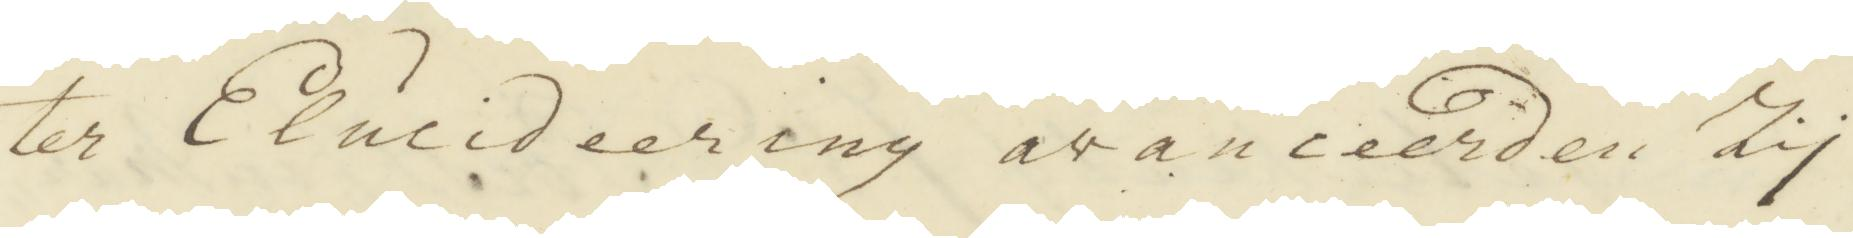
ter Elucideering avanceerden Zij
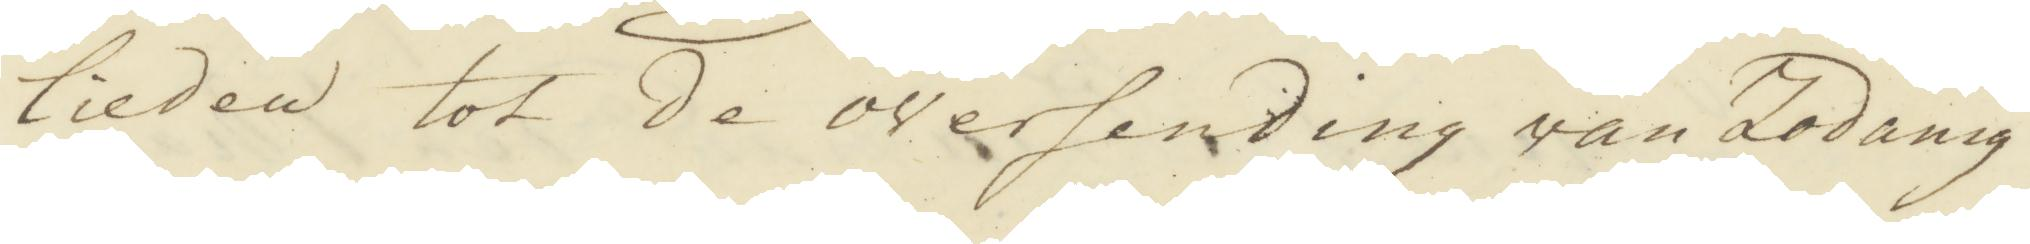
lieden tot de oversending van Zodanig
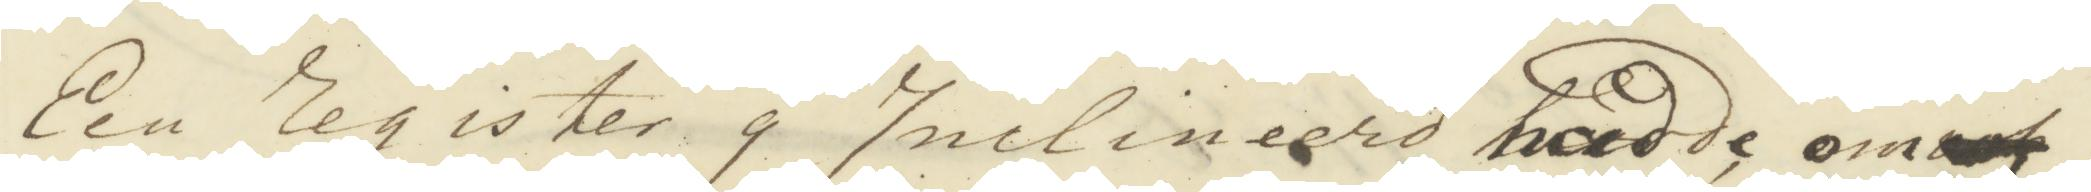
Een reg is ter g' Jnclineerd hadde, om rek
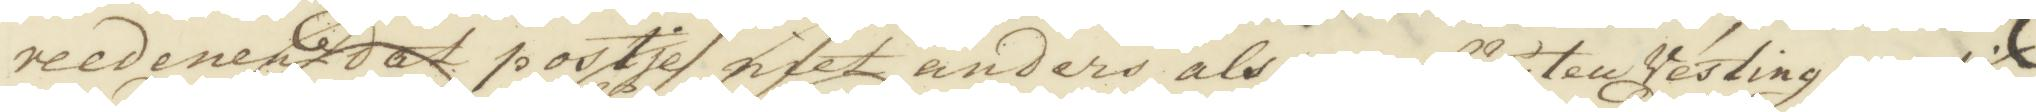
reedenen dat postje niet anders als een buijten vesting werkje
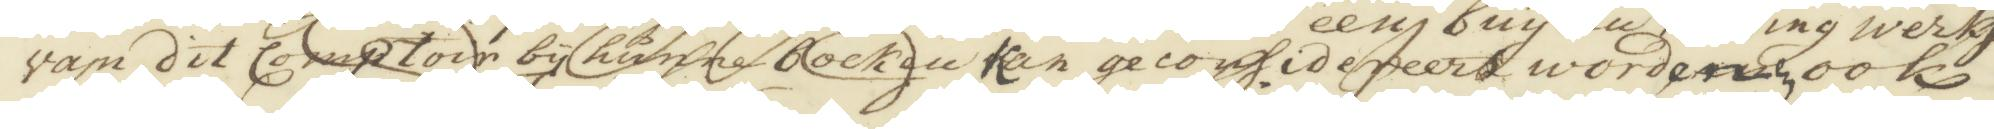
van dit Comptoir bij hunne boeken kan geconsidereert worden en ook
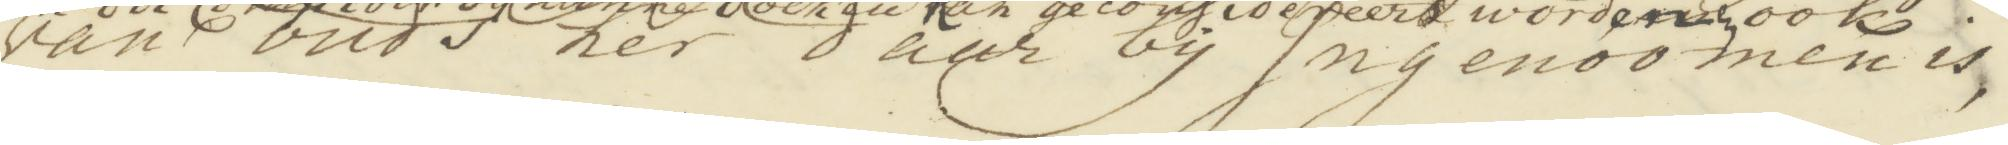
van ouds her daar bij Jngenoomen is,
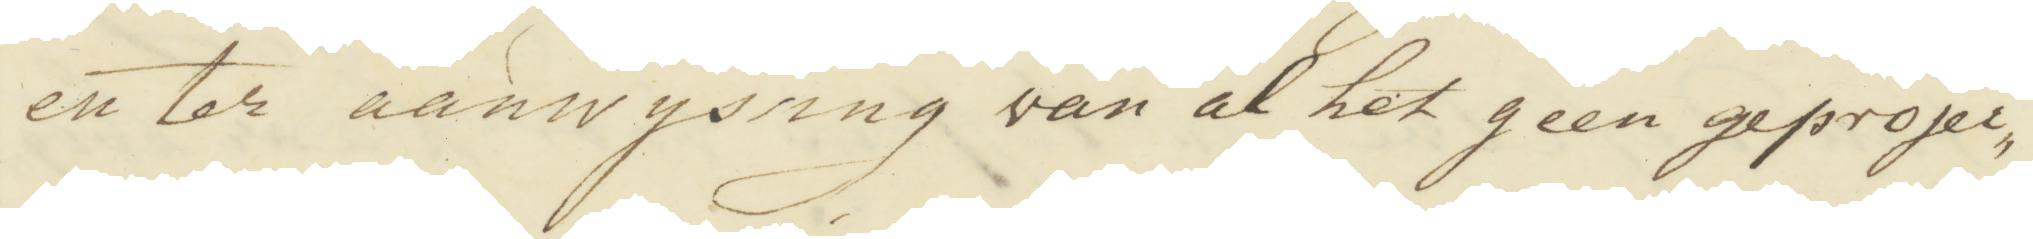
en ter aanwysing van al het geen geprojec„
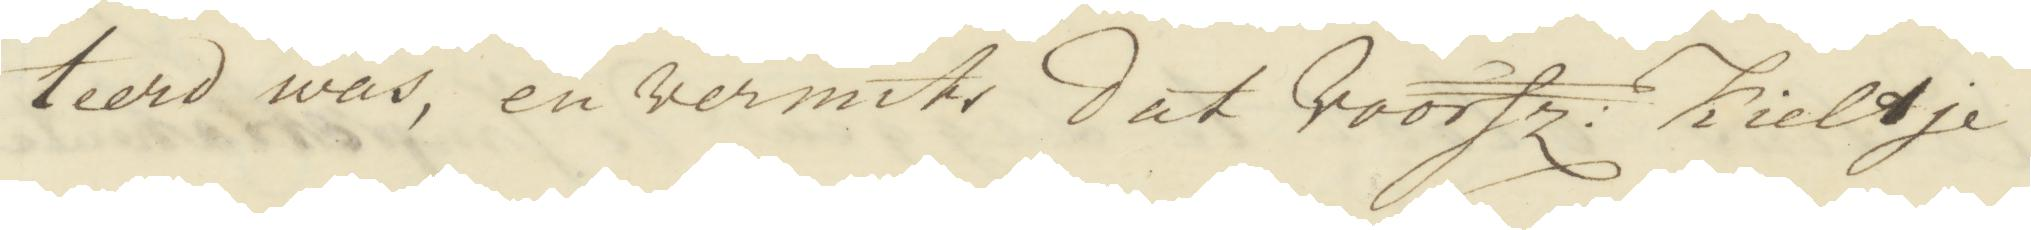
teerd was, en vermits dat voorsz: Kieltje
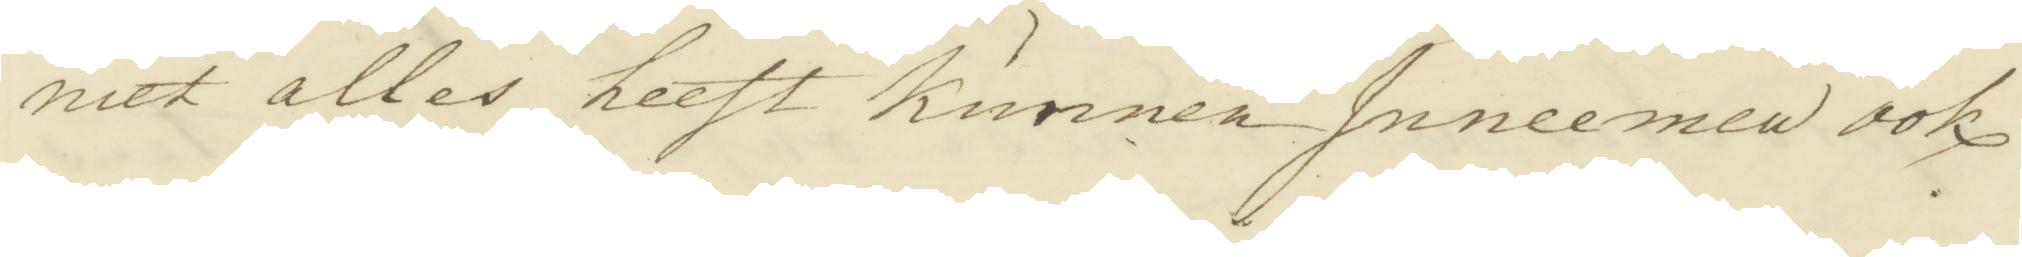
niet alles heeft kunnen Jnneemen ook
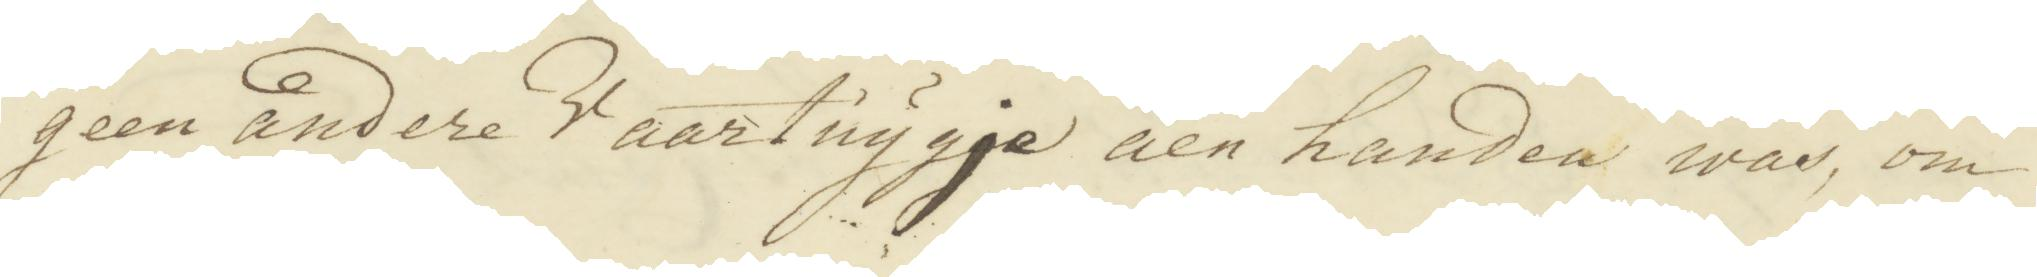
geen andere Vaartuijgje aen handen was, om
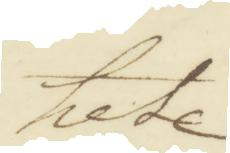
hete
